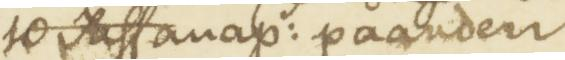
10 Iaftanap:s paarden
